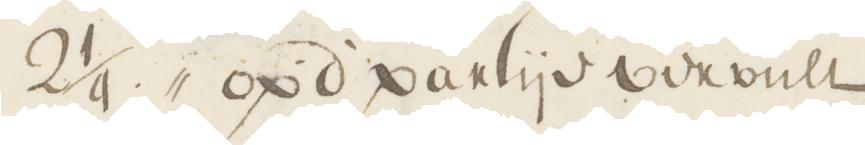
2¼. „ op d’ partije vervull
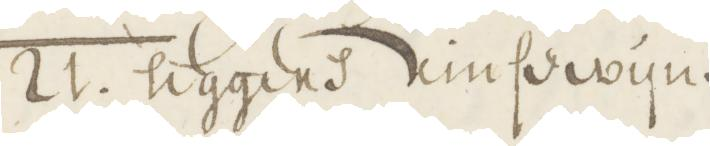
21. leggers rinsewijn
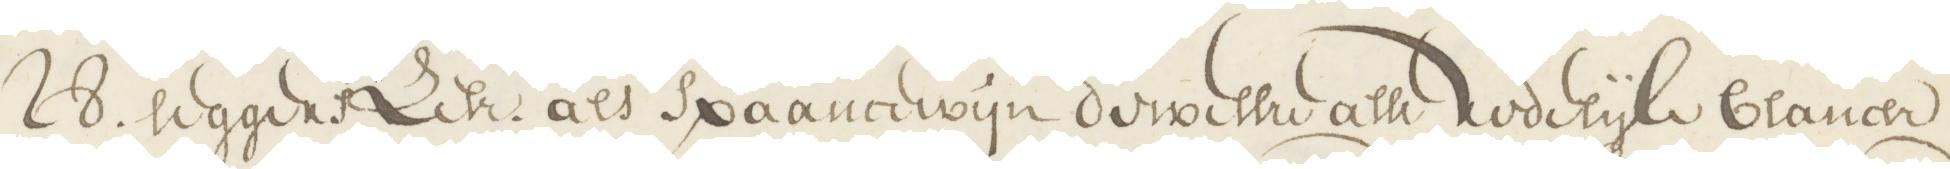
28. leggers Lek. als spaancewijn dewelke alle redelijk blanck
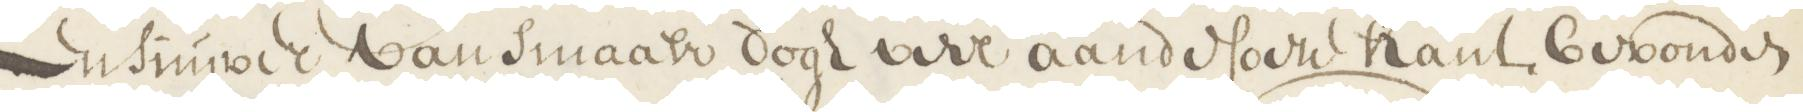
en simpel van smaak dogh veel aan de soere kant bevonden
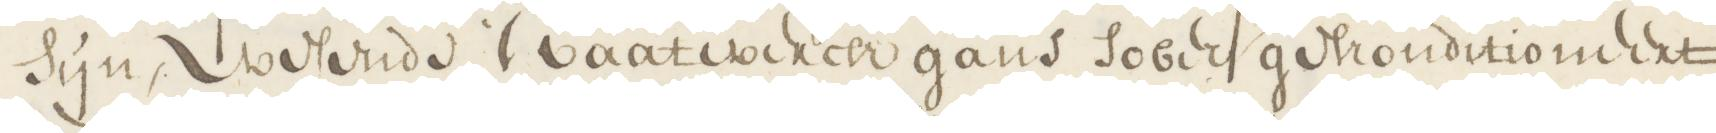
sijn, wesende ’t vaatwerck gans sober gekonditioneert
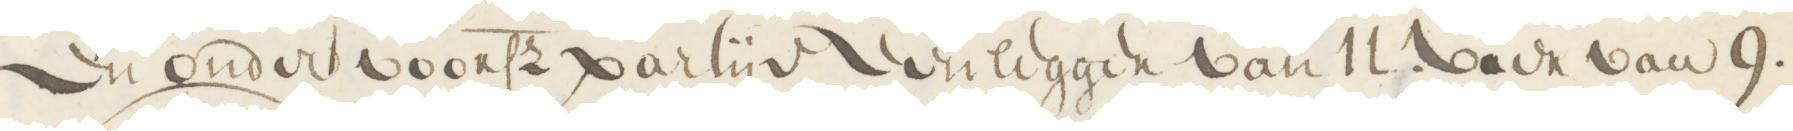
En onder voorsz partije een legger van 11. vier van 9.
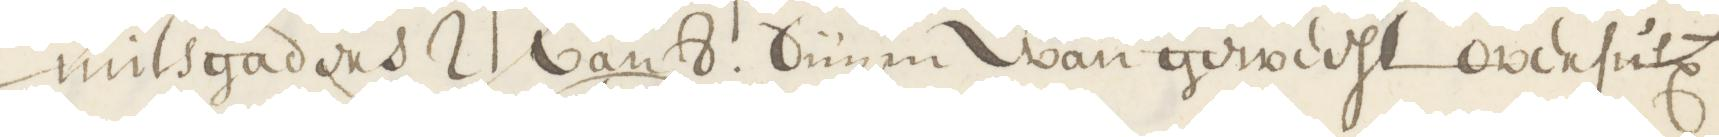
mitsgaders 2 van 8. duijm wan geweest oversulx
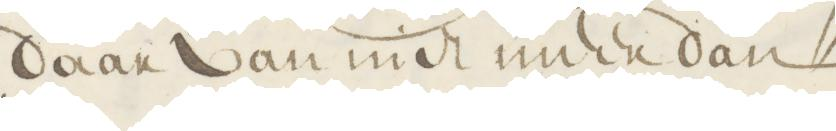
daar van niet meer dan
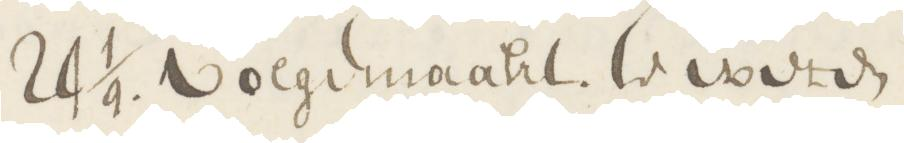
24¼. volgemaakt te weten
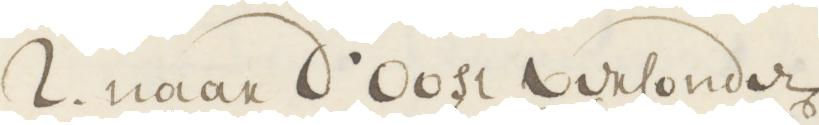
2. naar d’ Oost versonden
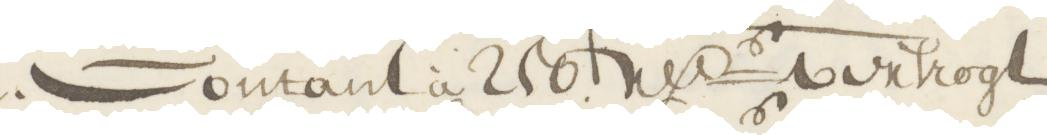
1. Contant à 250 RE=s verkogt
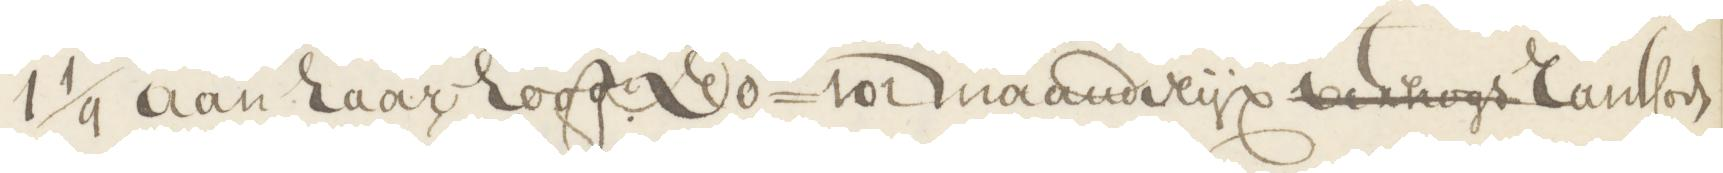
1¼ aan haar hoog:r Eo=s tor maandelijx verkogt Rantsoen
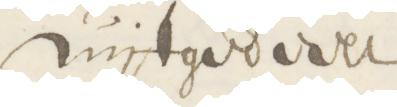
uijtgedeelt.
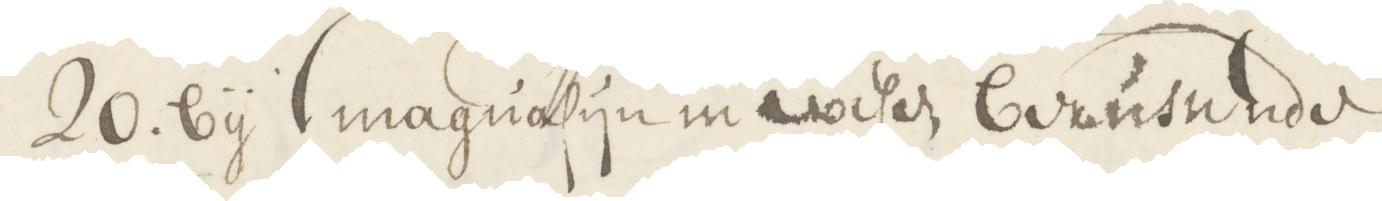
20. bij 't maguasijn in wesen berustende
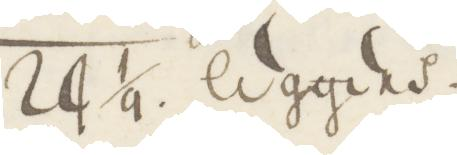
29¼. leggers
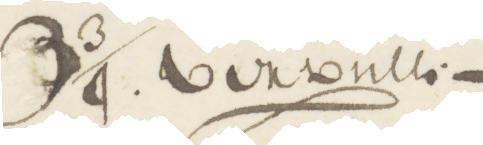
3¾. vervult
